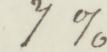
7%
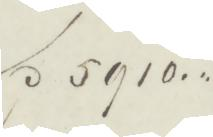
ƒ 5910.„
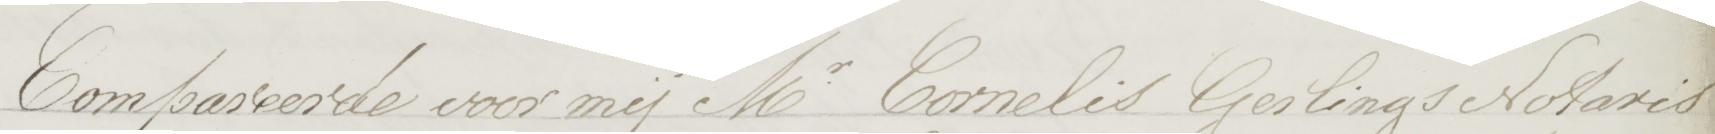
Compareerde voor mij Mr Cornelis Gerlings Notaris
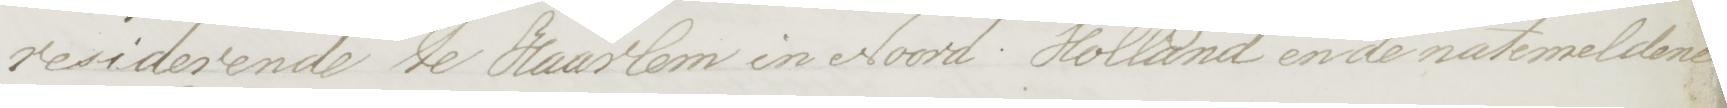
residerende te Haarlem in Noord. Holland en de natemeldene
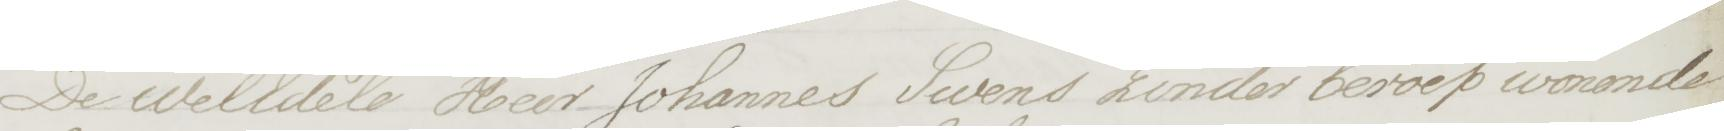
De WelEdele Heer Johannes Swens zonder beroep wonende
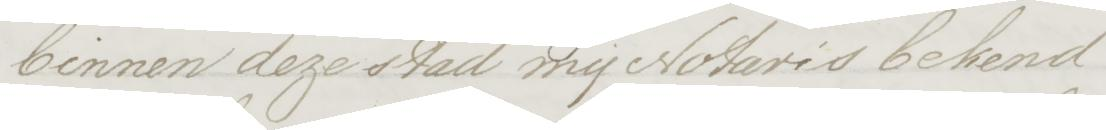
binnen deze stad mij Notaris bekend
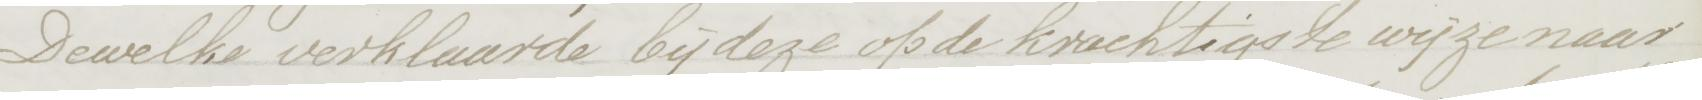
Dewelke verklaarde bij deze op de krachtigste wijze naar
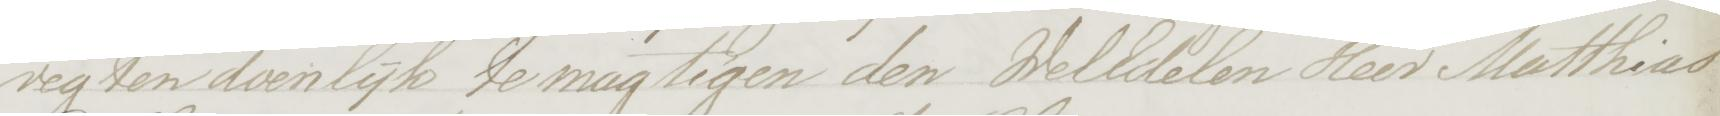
regten doenlijk te magtigen den WelEdelen Heer Matthias
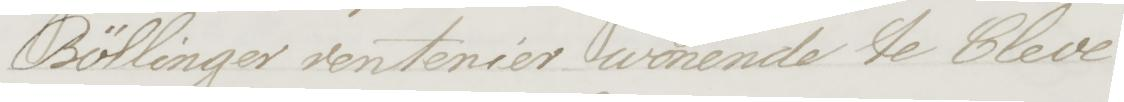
Böllinger rentenier wonende te Cleve
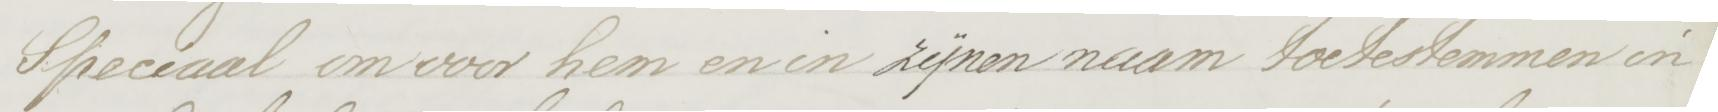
speciaal om voor hem en in zijnen naam toetestemmen in
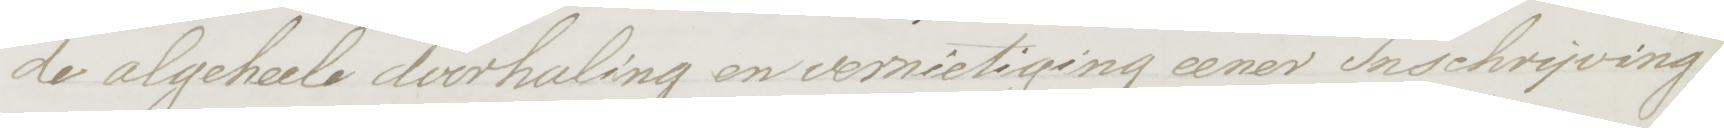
de algeheele doorhaling en vernietiging eener Inschrijving
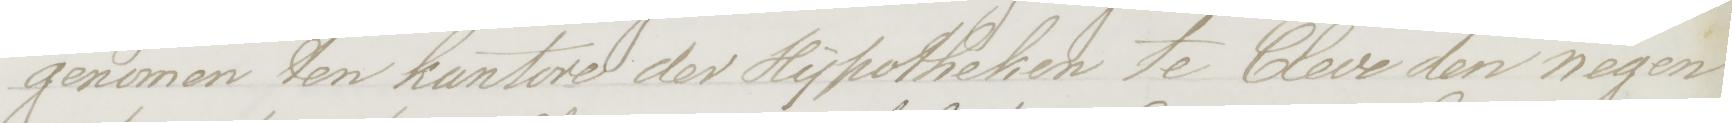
genomen ten kantore der Hijpotheken te Cleve den negen
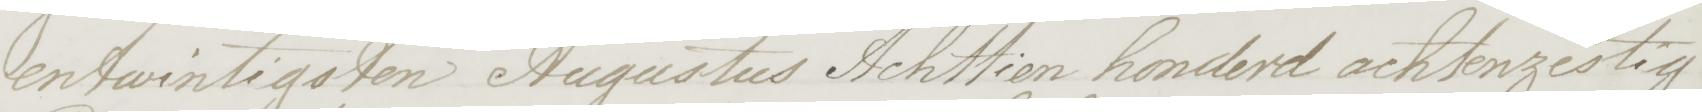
en twintigsten Augustus Achttien honderd achtenzestig
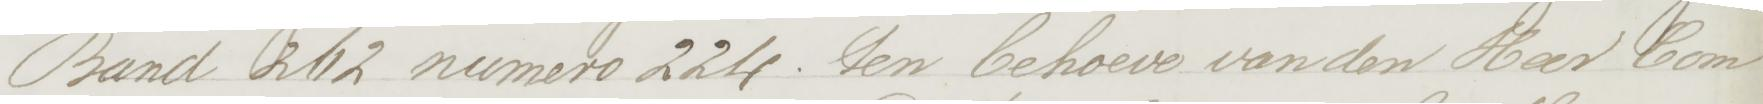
Band 262 numero 224. ten behoeve van den Heer Com
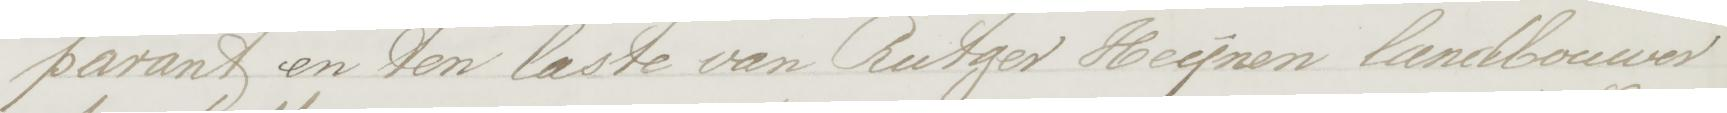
parant en ten laste van Rutger Heijnen landbouwer
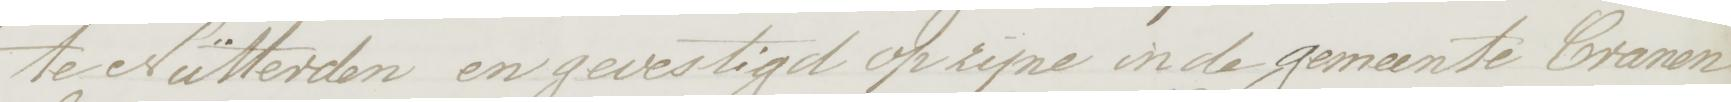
te Nütterden en gevestigd op zijne in de gemeente Cranen
